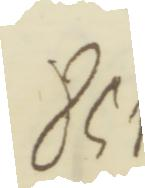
851
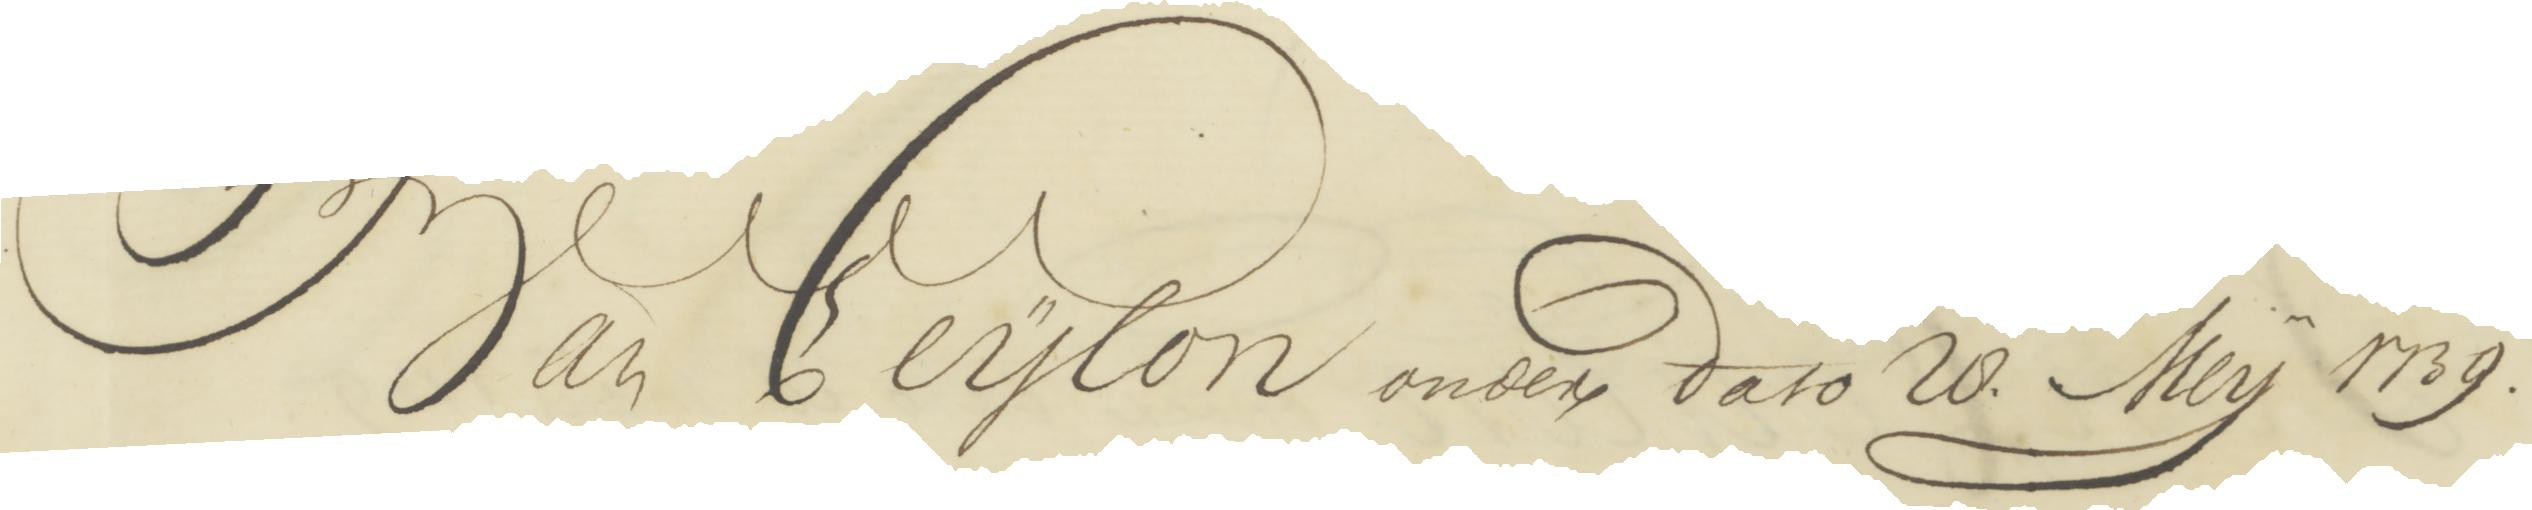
Van Ceijlon onder dato 20. Meij 1739.
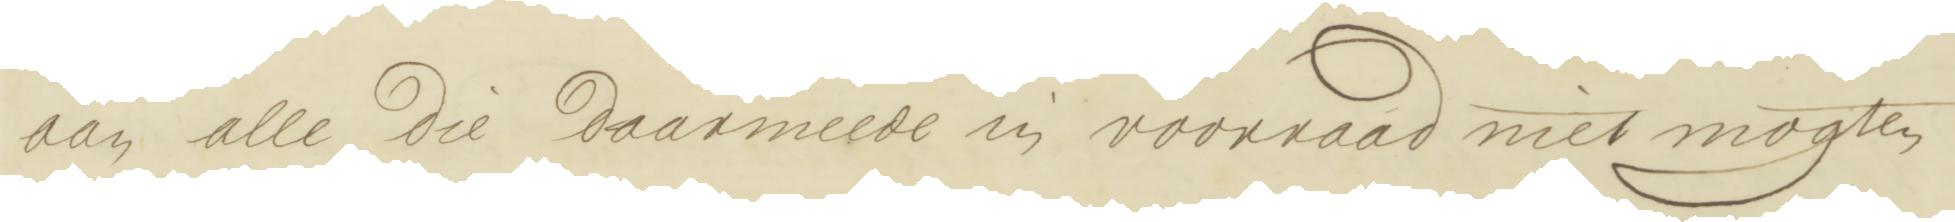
aan alle die daarmeede in voorraad niet mogten
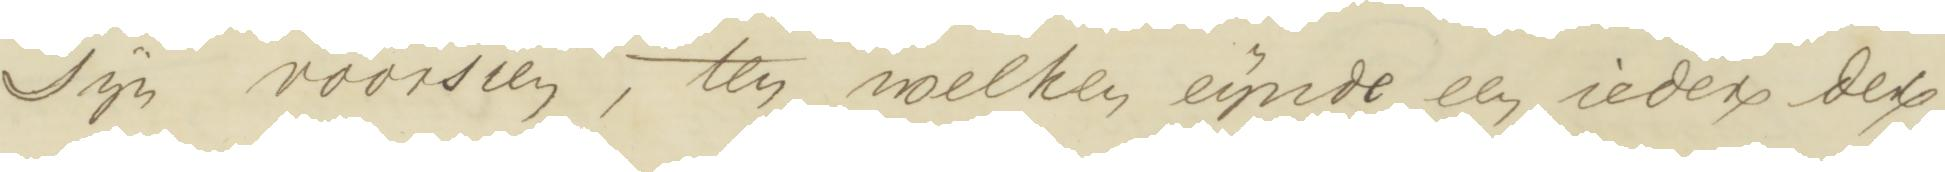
sijn voorsien, ten welken eijnde een ieder der
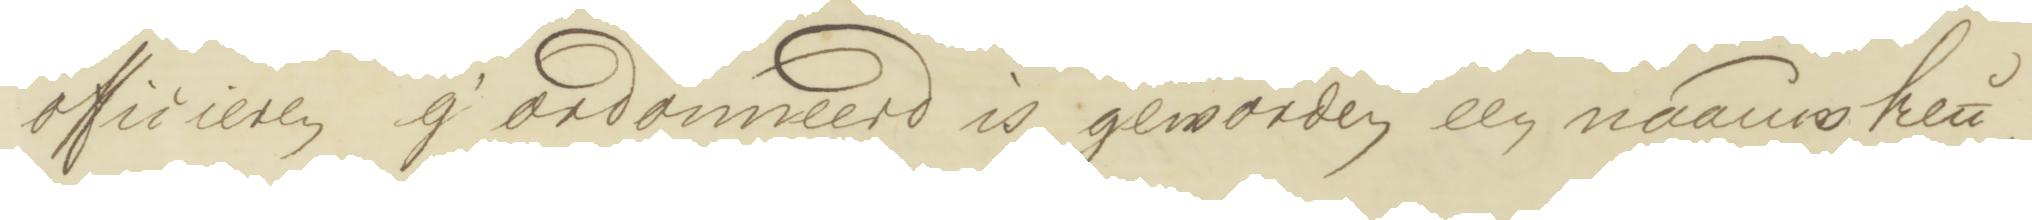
officieren g’ordonneerd is geworden een naauw keu„
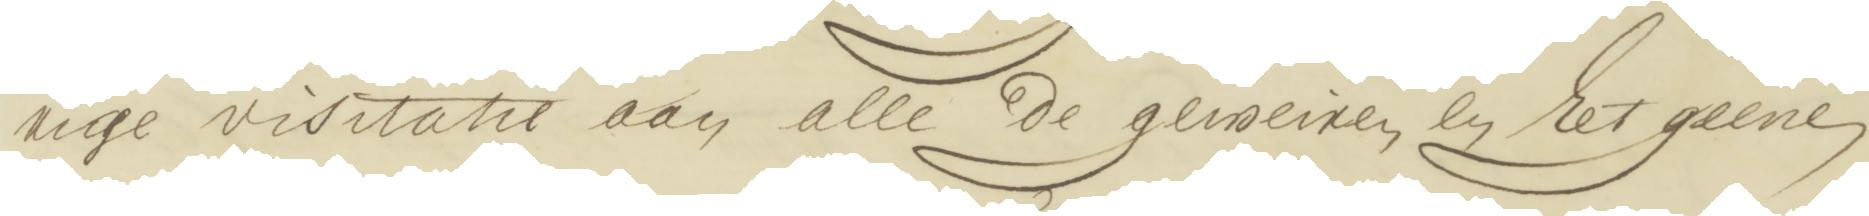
rige visitatie aan alle de geweiren en het geene
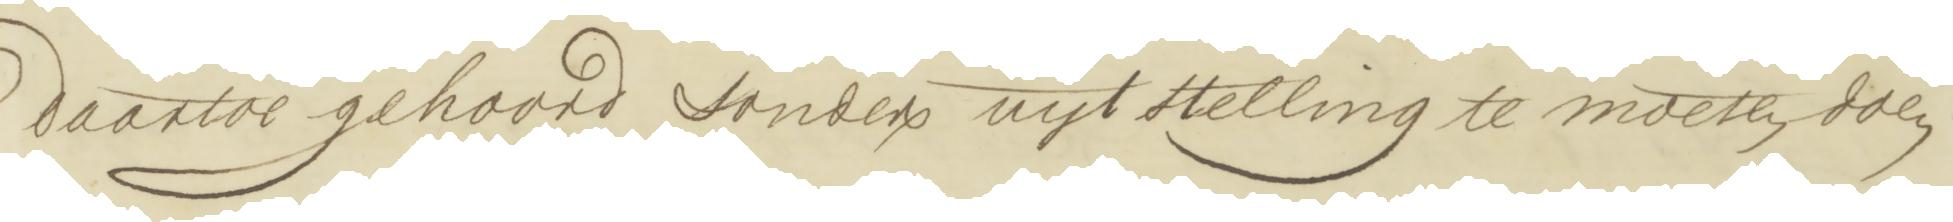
daartoe gehoord sonder uijt stelling te moeten doen
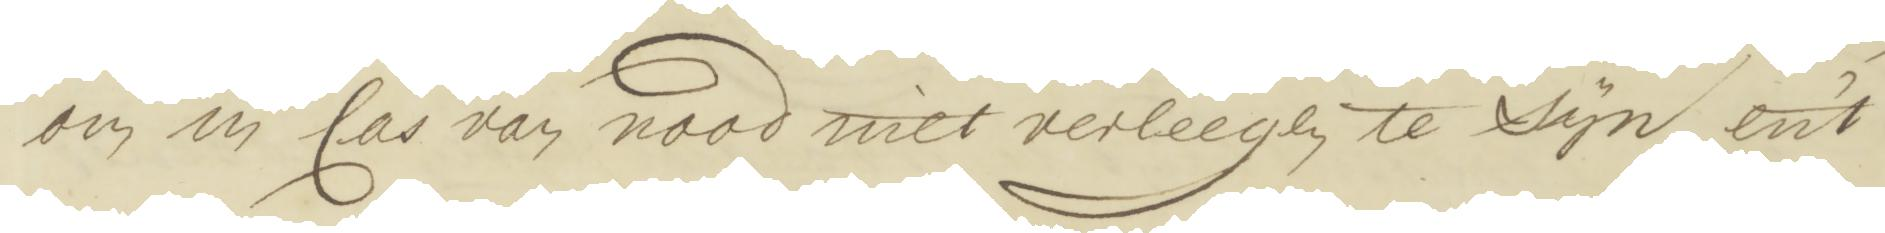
om in Cas van nood niet verleegen te zijn en’t
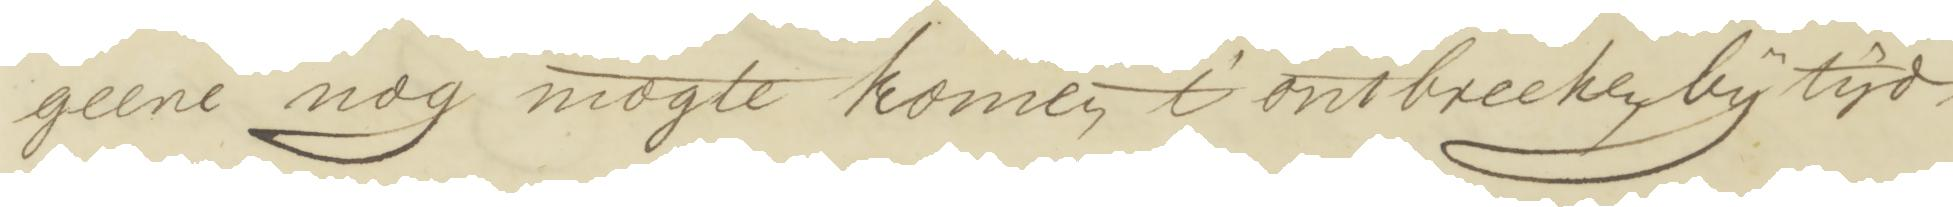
geene nog mogte komen t' ontbreeken bij tijd
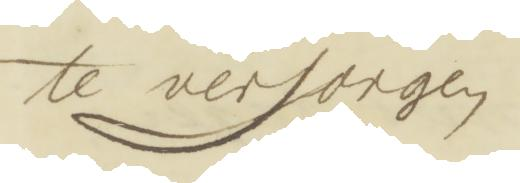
te versorgen
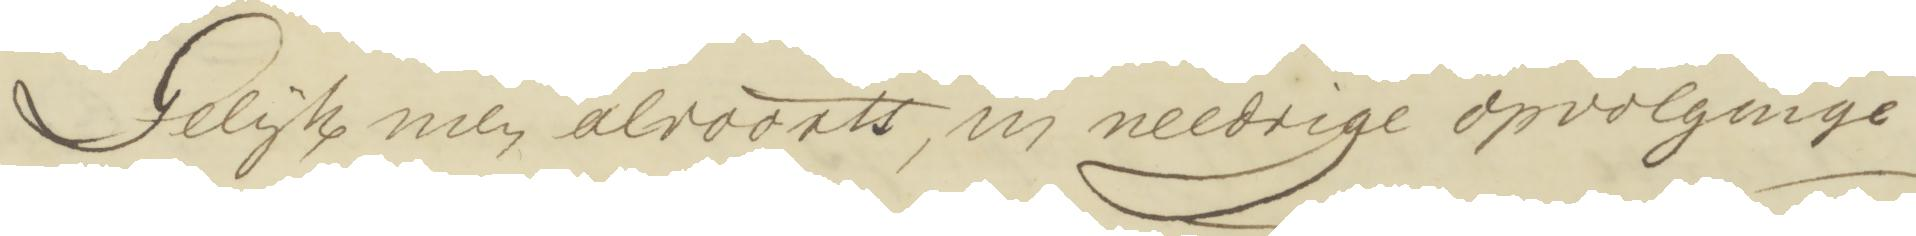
Gelijk men alvoorts, in needrige opvolginge
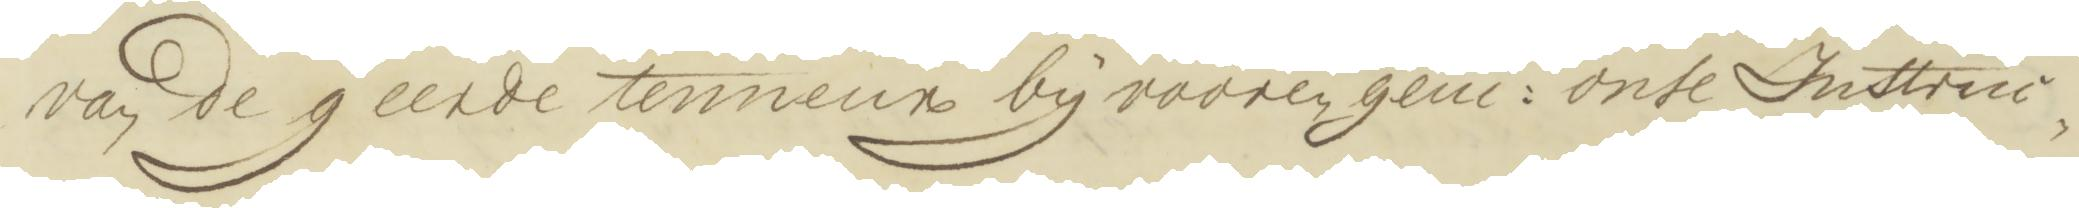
van de g'eerde tenneur bij vooren gem: onse Instruc„
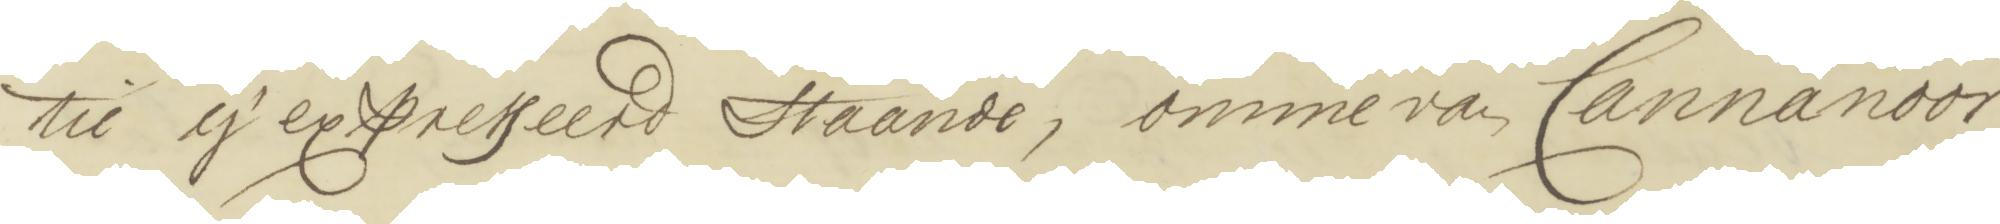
tie g' expresseerd staande, omme van Cannanoor
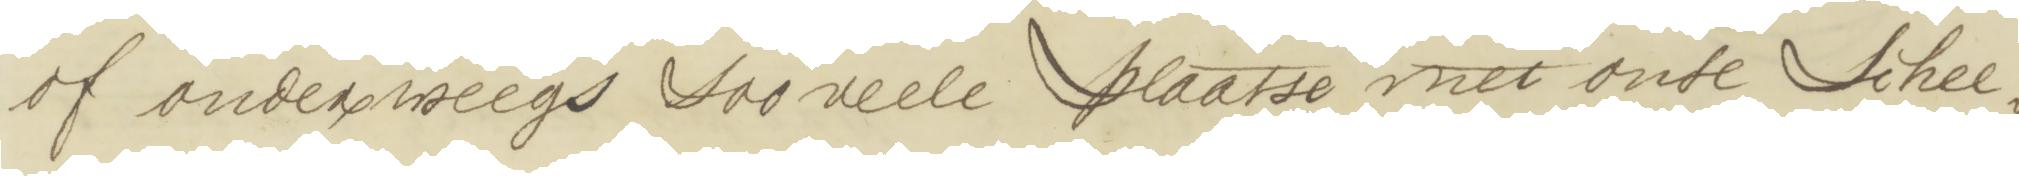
of onderweegs soo veele plaatse met onse schee„
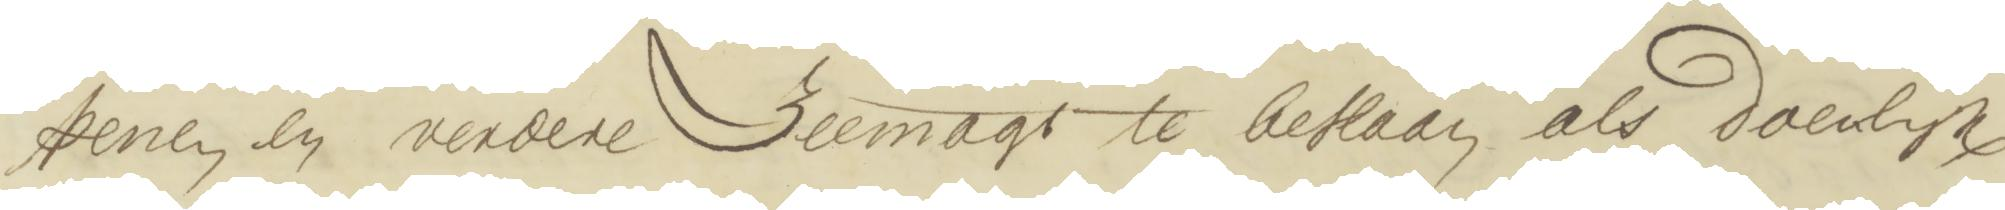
penen en verdere zeemagt te beslaan als doenlijk
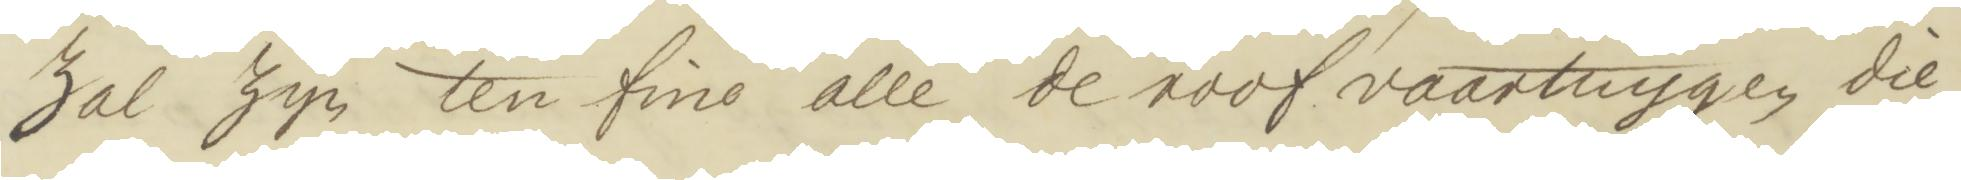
zal zijn ten fino alle de roof vaartuijgen die
